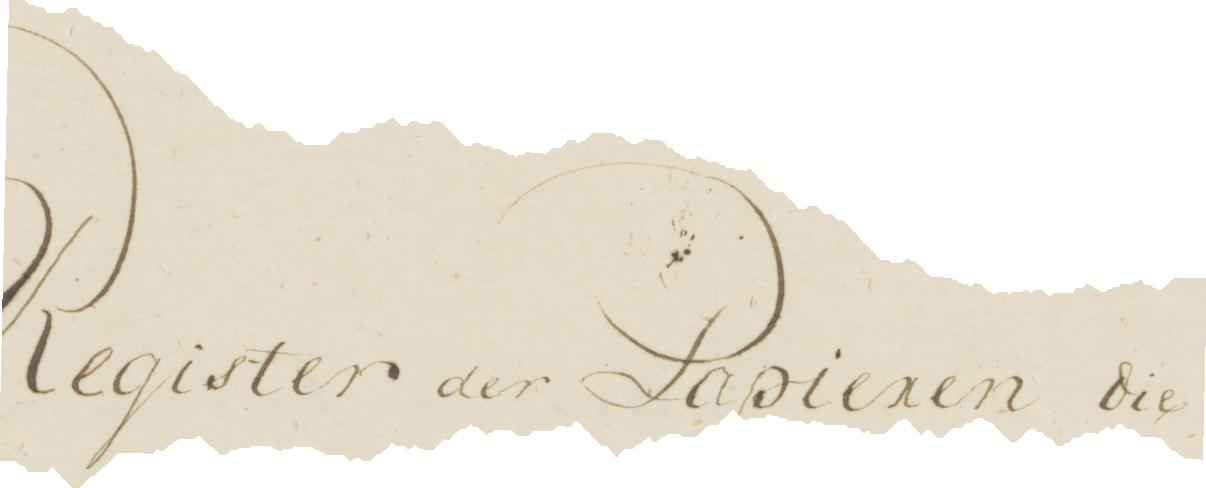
Register der Papieren die
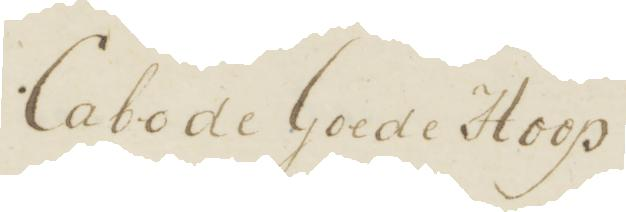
Cabo de Goede Hoop
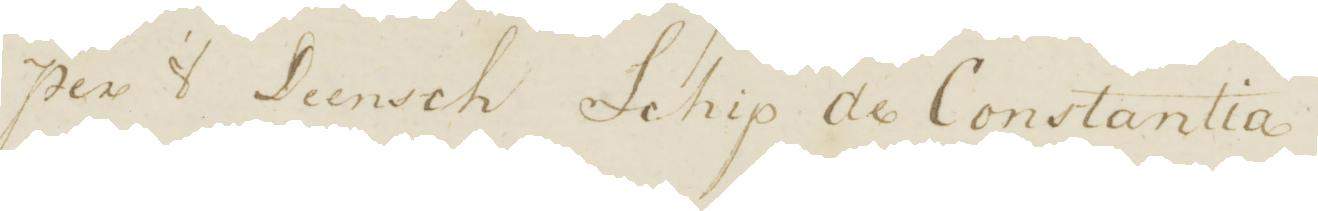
per 't Deensch schip de Constantia
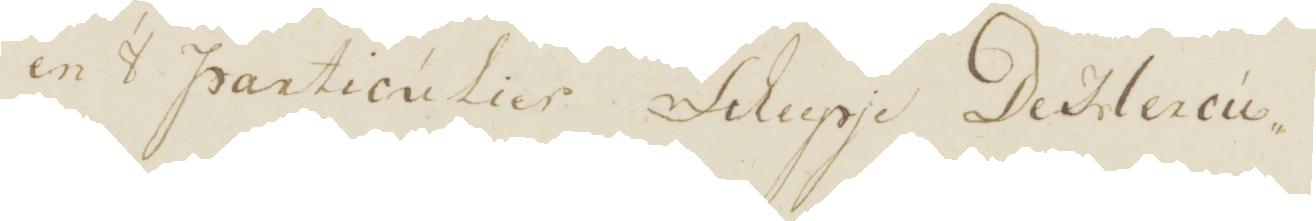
en 't particulier scheepje De Hercu„
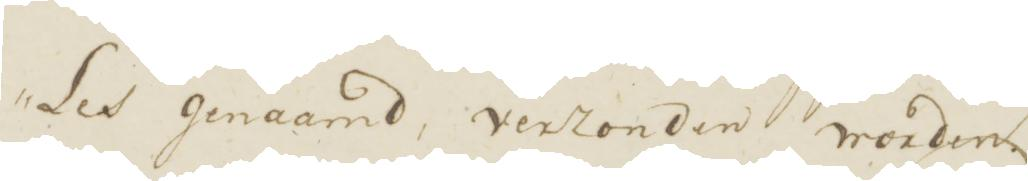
„Les genaamd, verzonden worden.
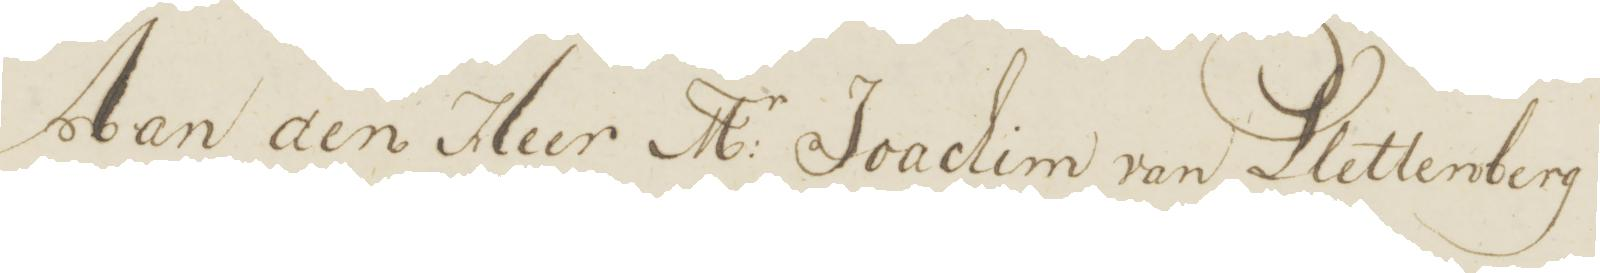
Aan den Heer M:r Joachim van Plettenberg
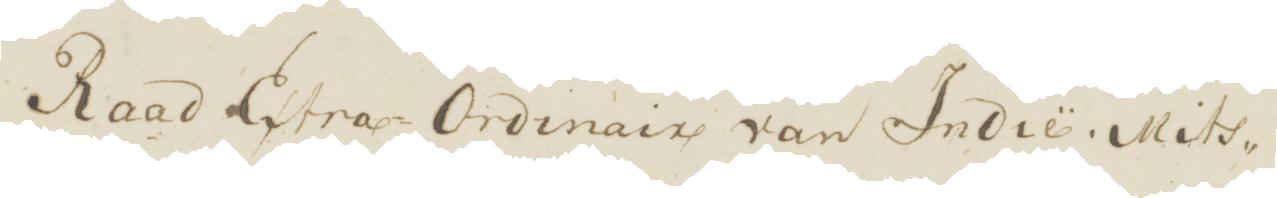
Raad Extra=Ordinair van Indië, Mits„
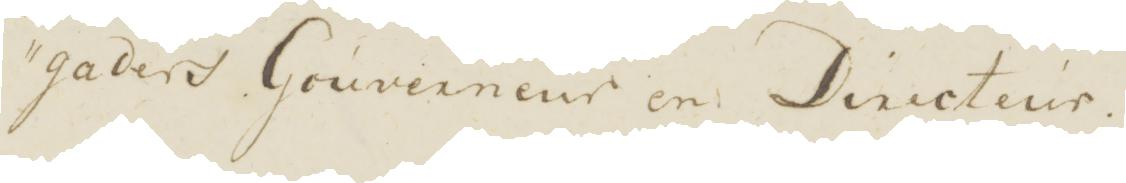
„gaders Gouverneur en Directeur
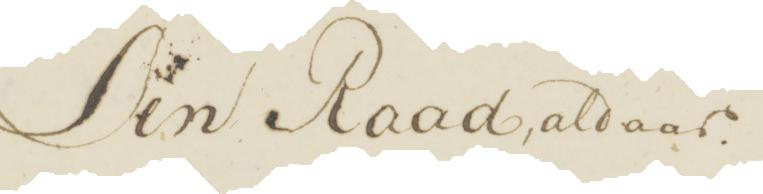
Den Raad, aldaar.
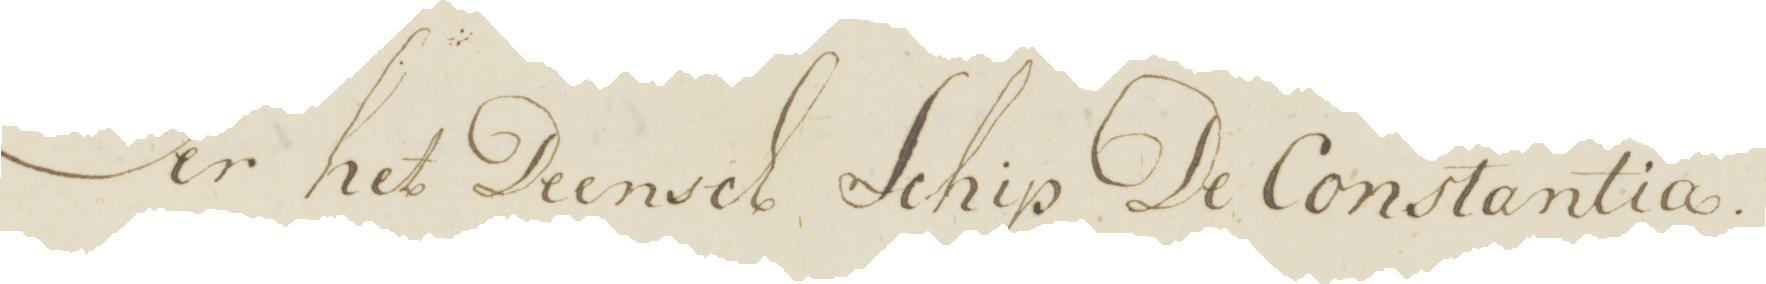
Per het Deensch schip De Constantia.
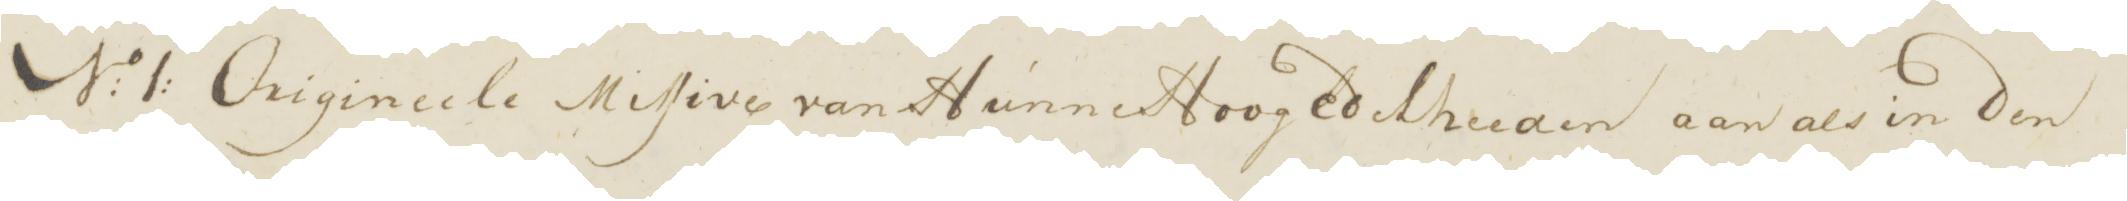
N:o 1 Origineele missive van Hunne Hoog Edelheeden aan als in den
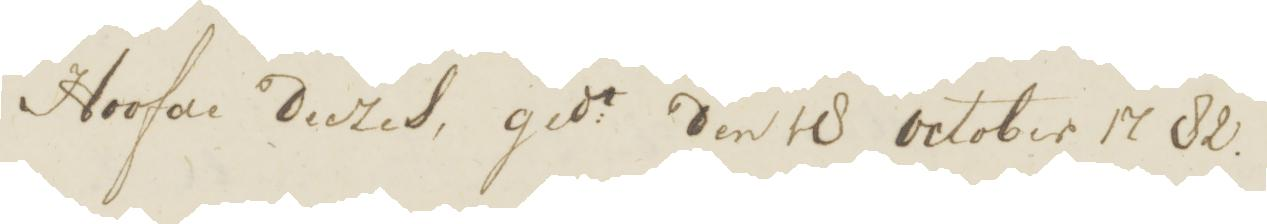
Hoofde Deezes, ged:t den 18 october 1782.
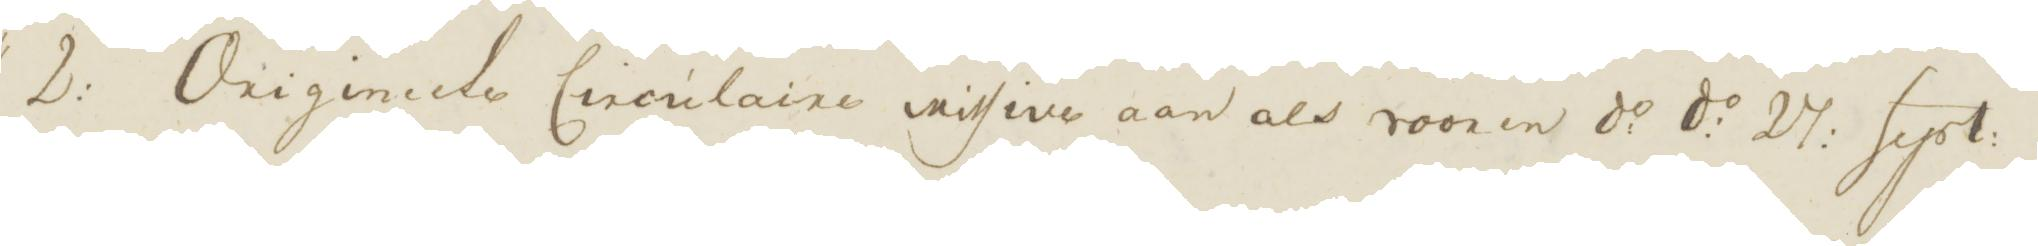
2: Origineele Circulaire missive aan als vooren d:o d:o 27: Sept:
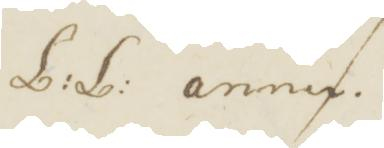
L:L: annex.
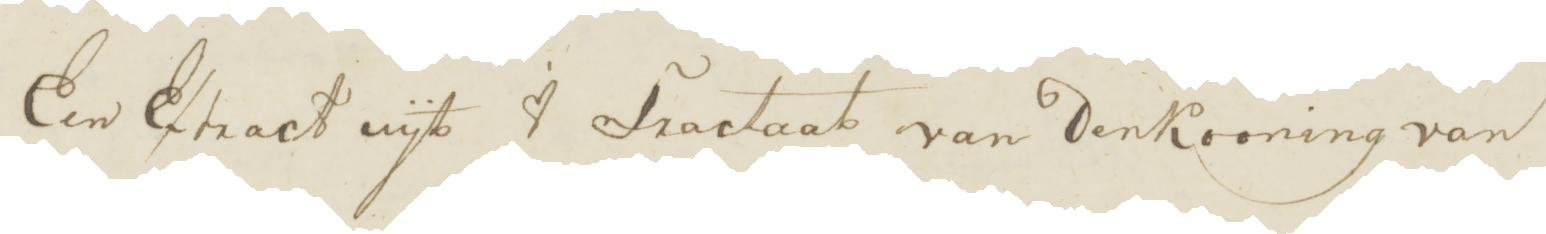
Een Extract uijt 't Tractaat van den Kooning van
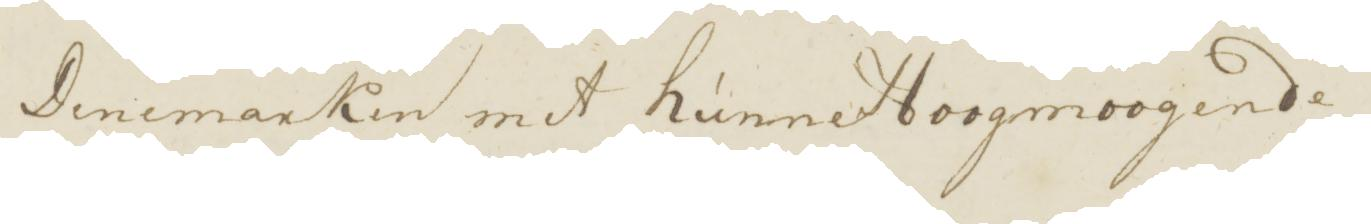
Denemarken met hunne Hoogmoogende
